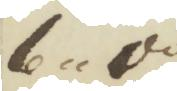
6 „ do
